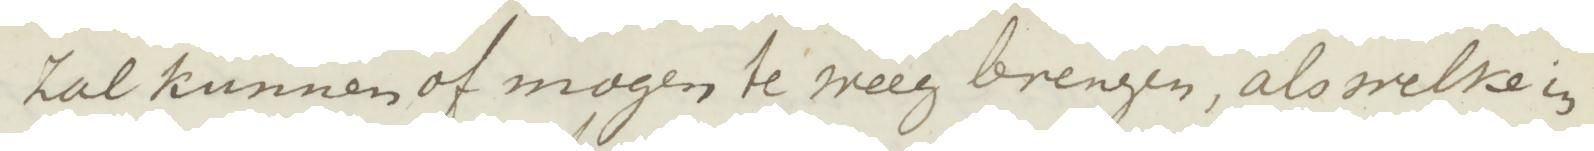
zal kunnen of mogen te weeg brengen, als welke in
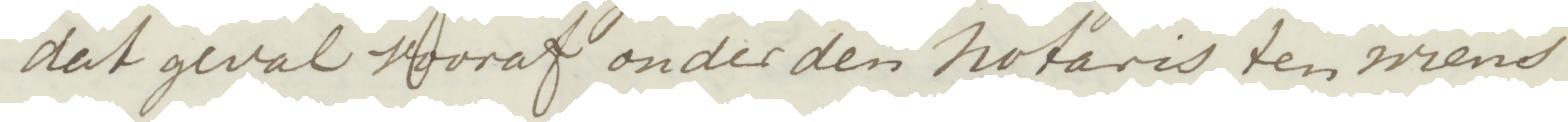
dat geval vooraf onder den notaris, ten wiens
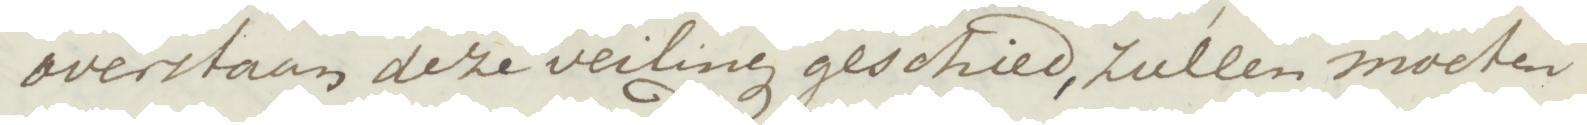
overstaan deze veiling geschied, zullen moeten
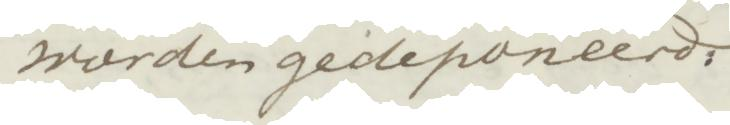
worden gedeponeerd:
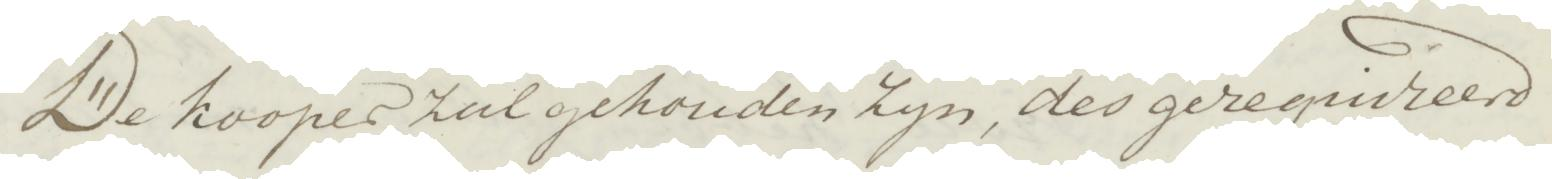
De kooper zal gehouden zyn, des gerequireerd
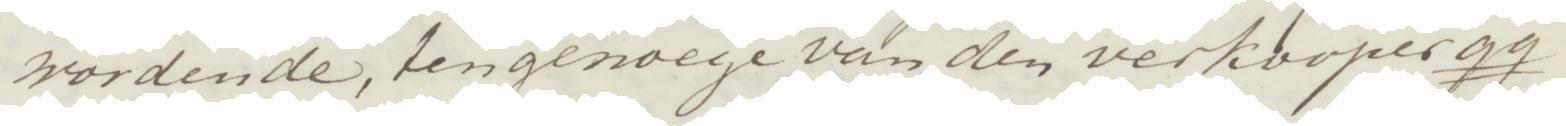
wordende, ten genoege van den verkooper qq
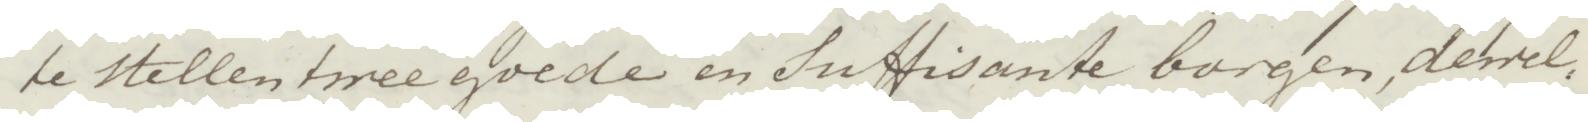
te stellen twee goede en suffisante borgen, dewel:
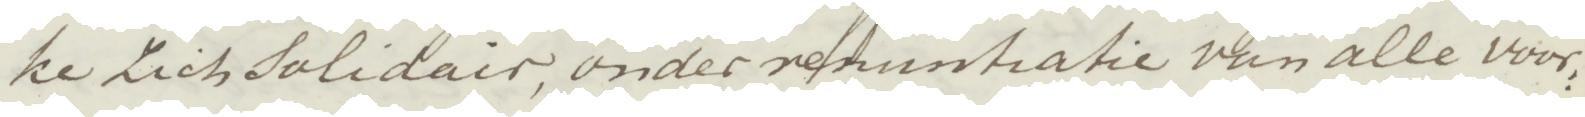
=ke zich solidair, onder renuntiatie van alle voor:
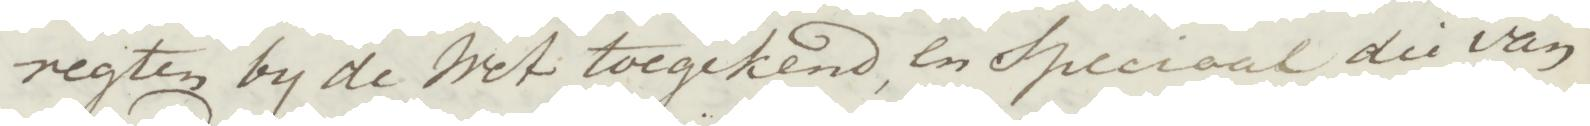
=regten by de wet toegekend, en speciaal die van
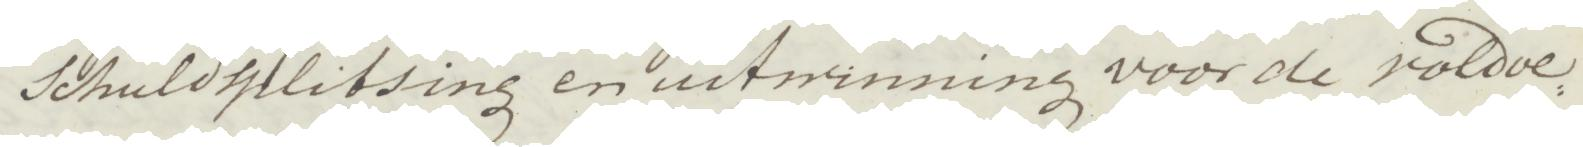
schuldsplitsing en uitwinning voor de voldoe=
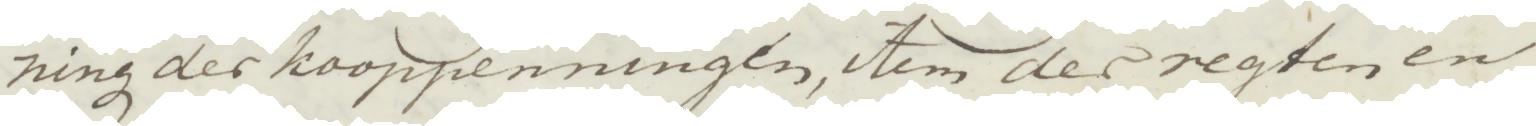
=ning der kooppenningen, item der regten en
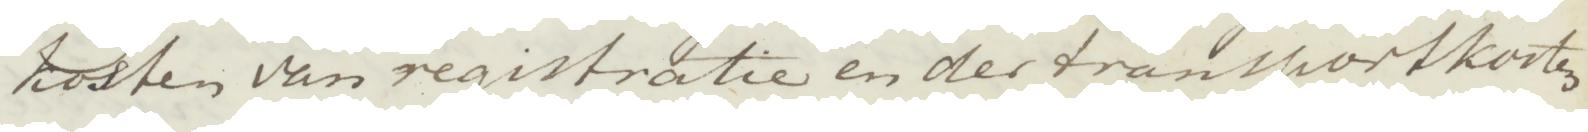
kosten van registratie en der transportkosten
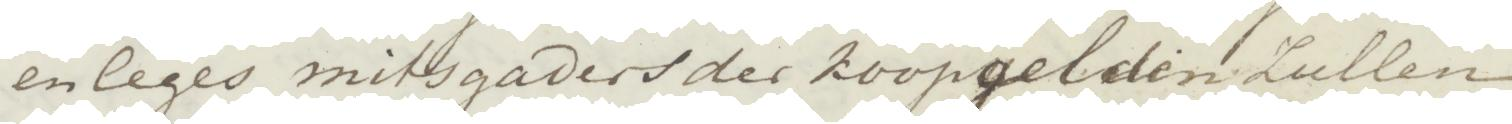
en leges, mitsgaders der koopgelden zullen
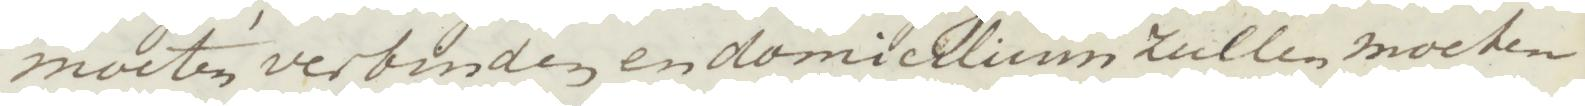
moeten verbinden en domicilium zullen moeten
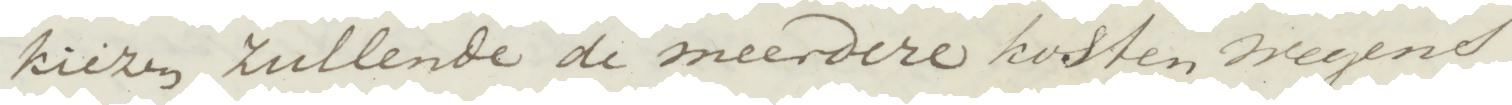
kiezen, zullende de meerdere kosten wegens
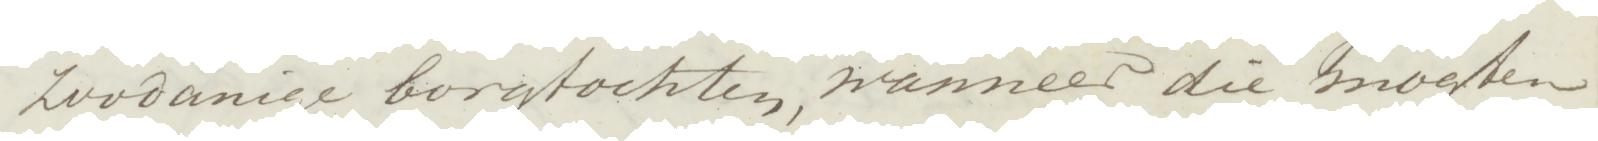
zoodanige borgtochten, wanneer die mogten
